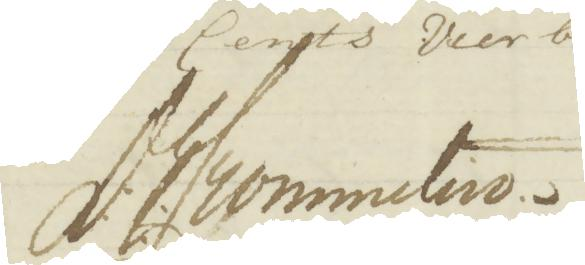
D:F:Crommelin.-
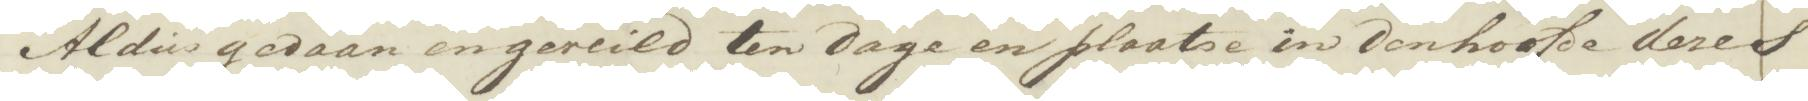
Aldus gedaan en geveild ten dage en plaatse in den hoofde dezes
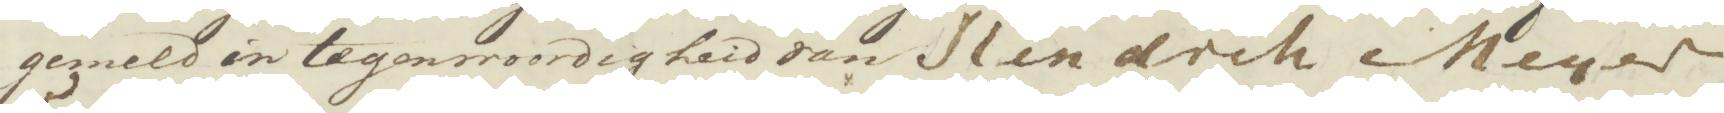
gemeld in tegenwoordigheid van Hendrik Meyer
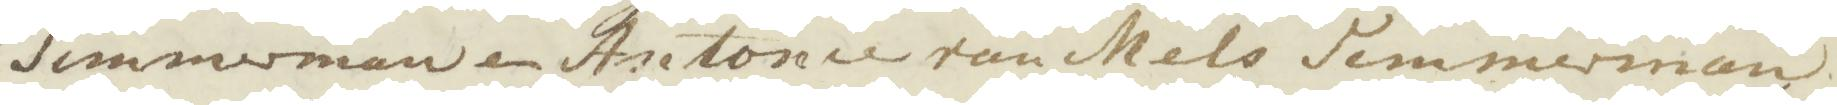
Timmerman en Antonie van Mels Timmerman
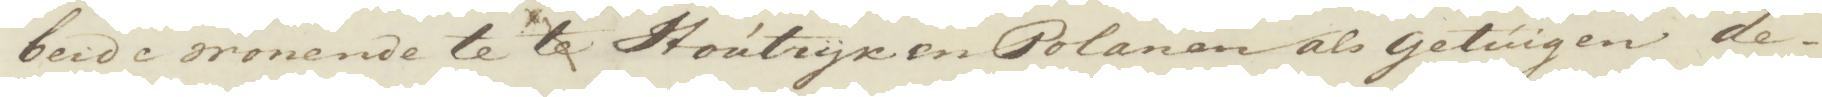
beide wonende te te Houtrijk en Polanen als getuigen de-
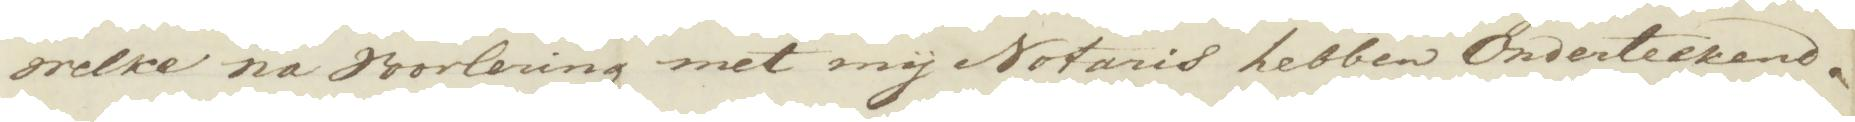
welke na voorlezing met mij Notaris hebben Onderteekend,
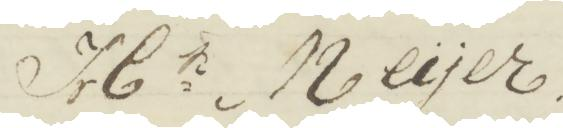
H=k Meijer
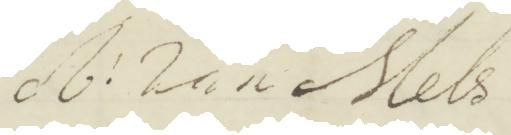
A: Van Mels
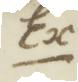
Ex'
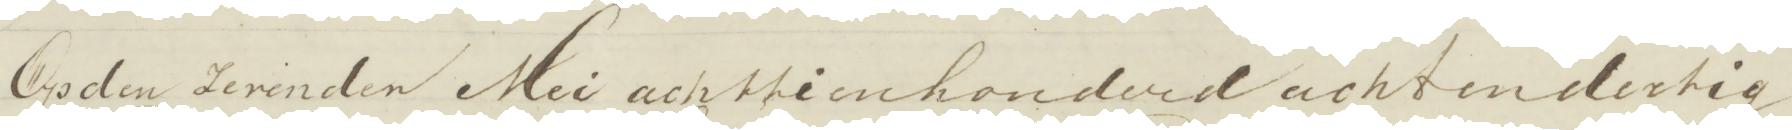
Op den zevenden Mei achttienhonderd acht en dertig
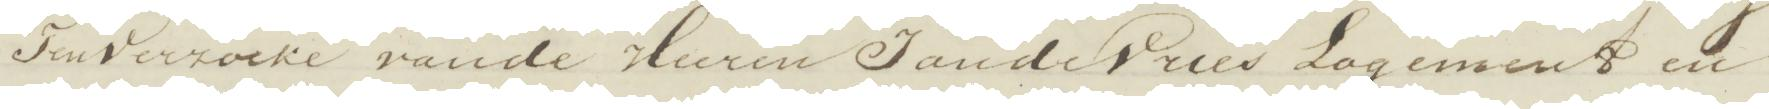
Ten Verzoeke vande Heeren Ian de Vries Logement en
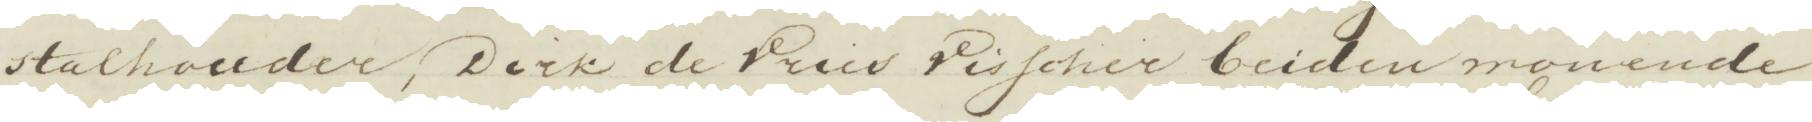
stalhouder, Dirk de Vries Visscher beiden wonende
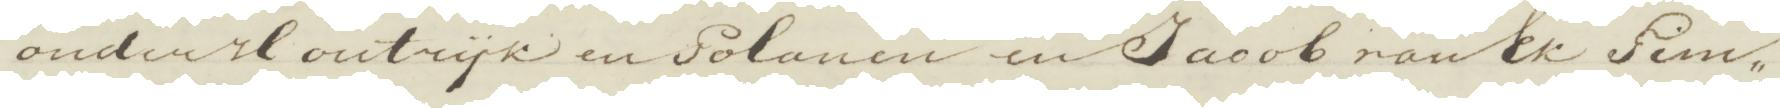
onder Houtrijk en Polanen en Iacob van Ek Tim„
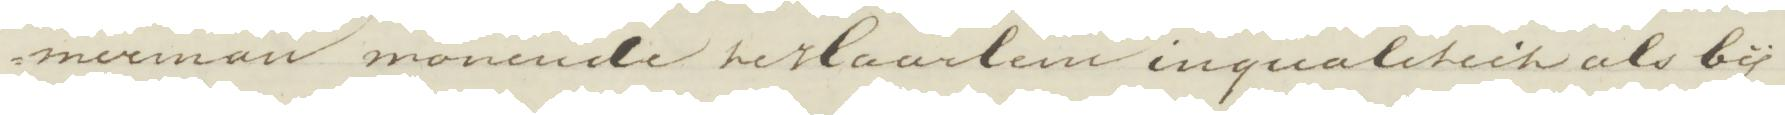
=merman wonende te Haarlem inqualiteit als bij
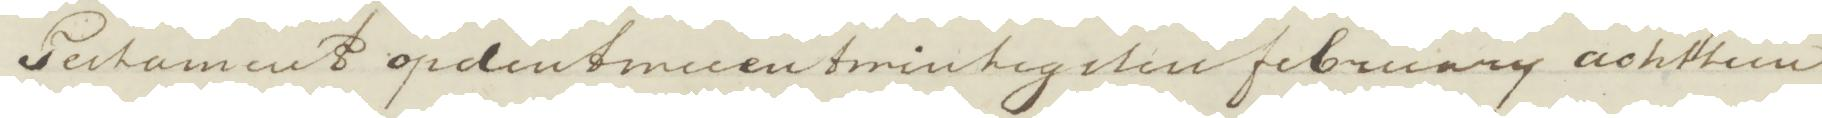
Testament op den twee en twintigsten february achttien
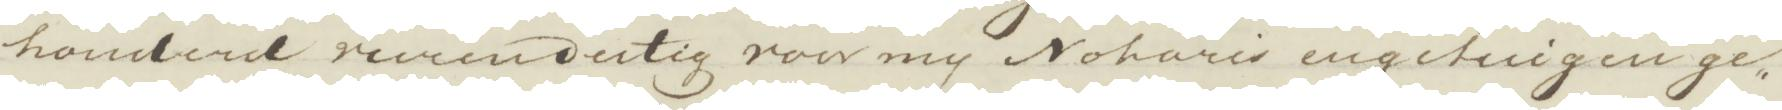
honderd vierendertig voor my Notaris en getuigen ge„
